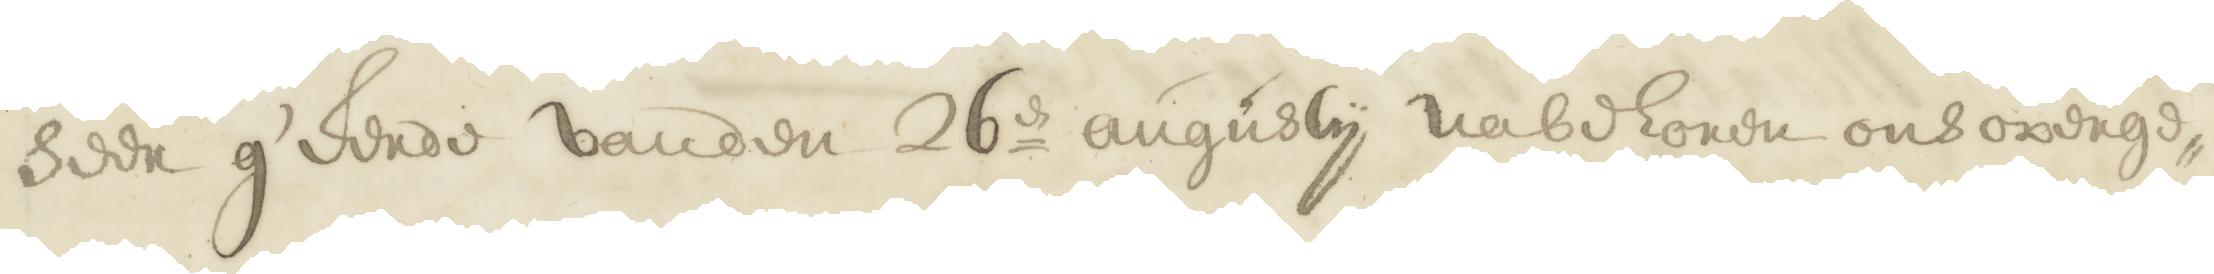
seer g’Eerde vanden 26=en augustij Nabehoren ons overge„
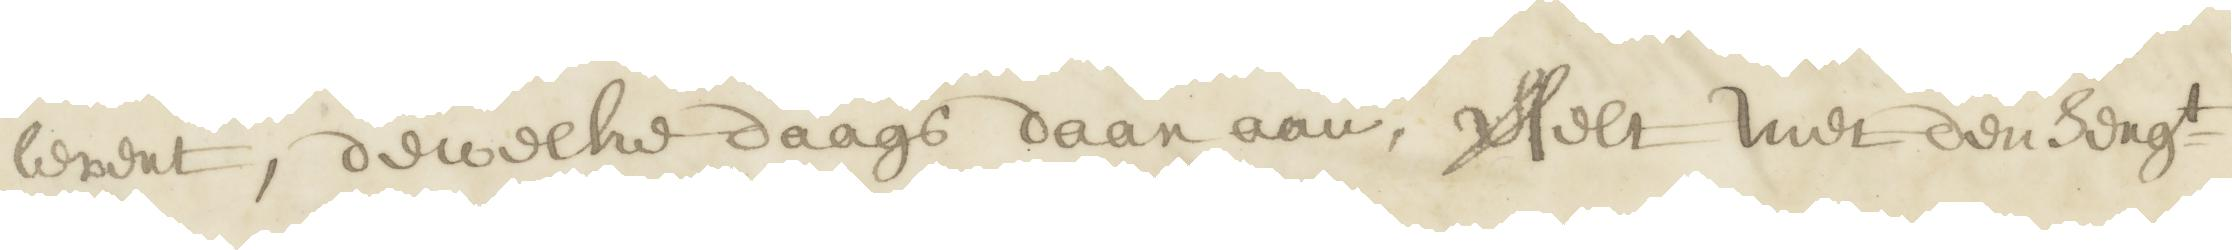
levert, dewelke daags daar aan, verselt Met den serg=t
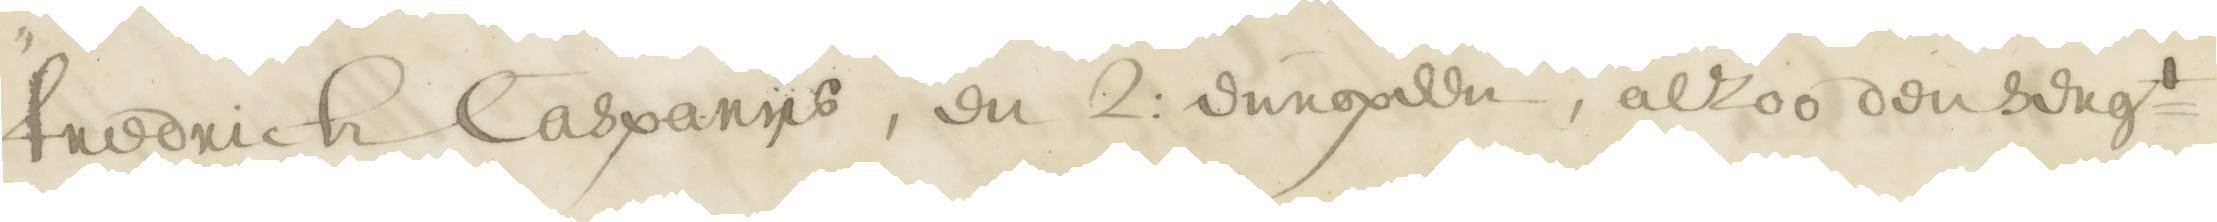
Fredrick Casparus, en 2: europeen, alzoo den serg=t
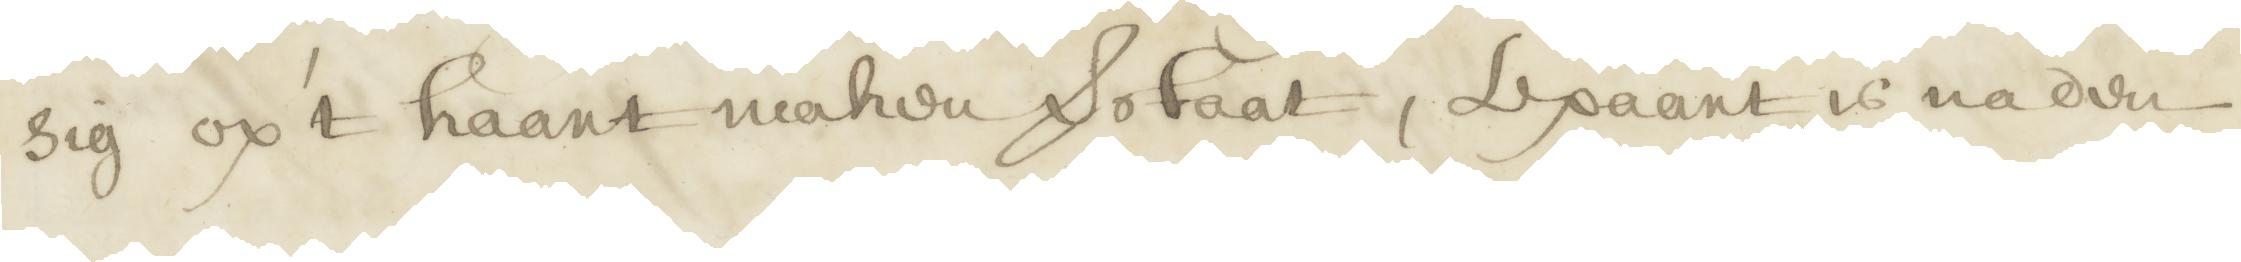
sig op ’t kaart maken verstaat, tepaart is na den
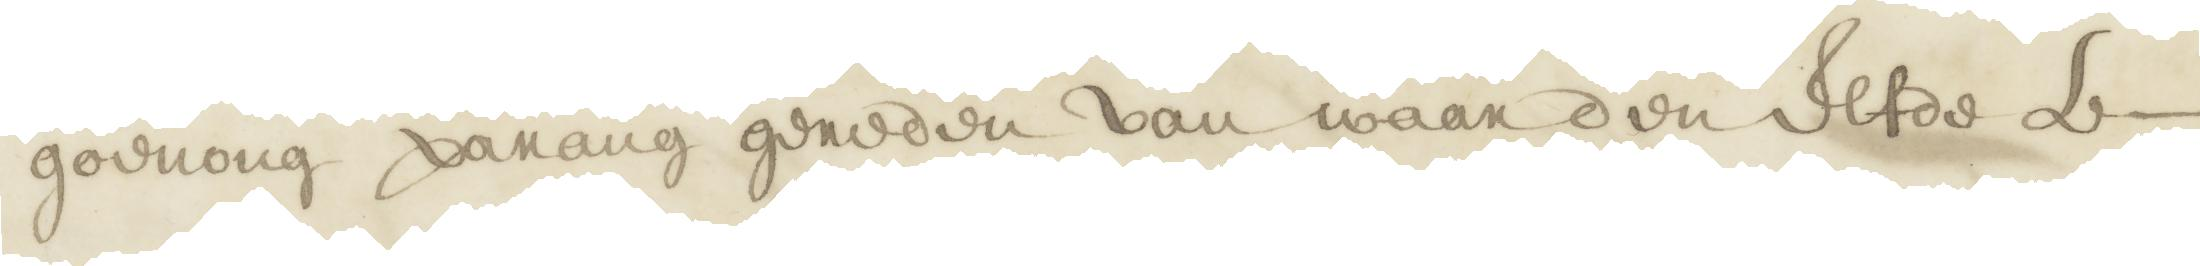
goenong parang gereden Van waar den Elfde Te
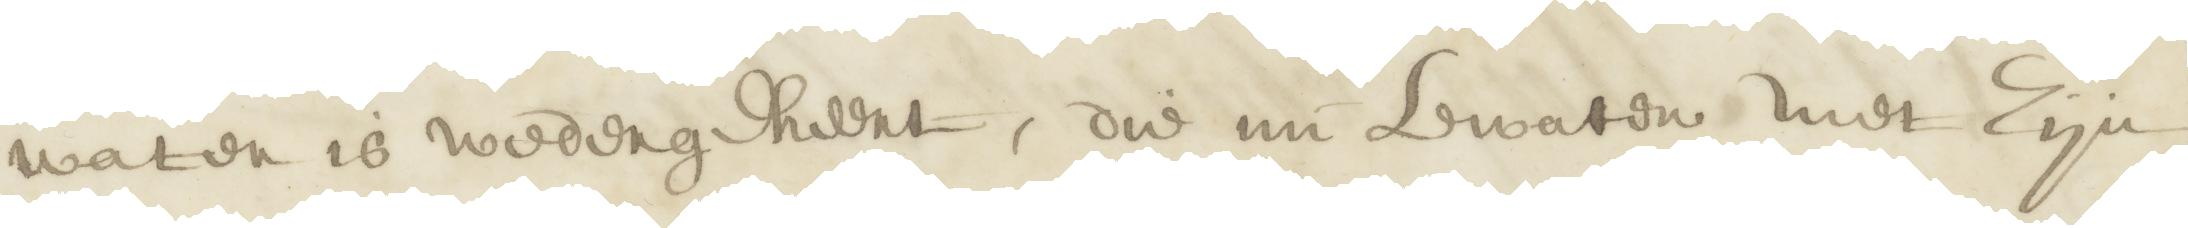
water is wedergekeert, die nu Tewater Met zijn
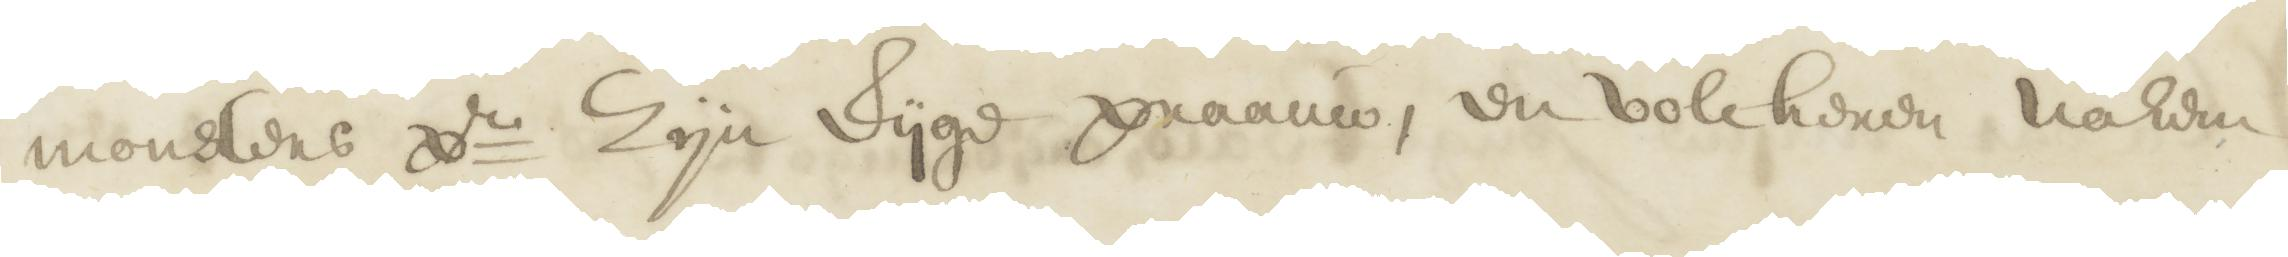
monsters p=r zijn Eijge praauw, en Volckeren nahem
